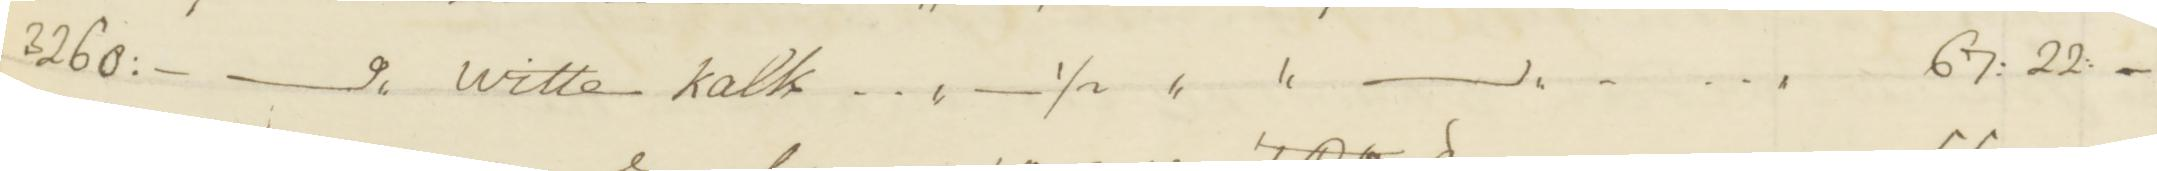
3260:— _„o witte kalk - - „ —½ „ „ _„o - - - „ 67: 22: —
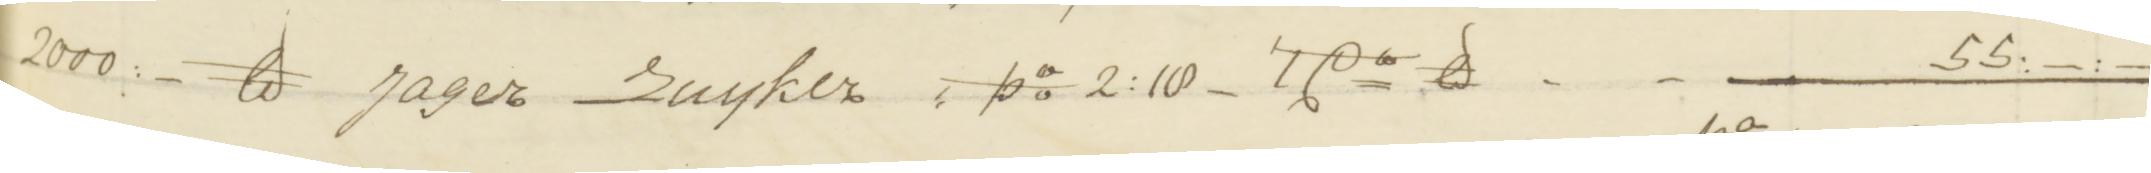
2000:- lb jager zuijker „ p a/o 2:18 — tC=to lb - - „ 55: —: —
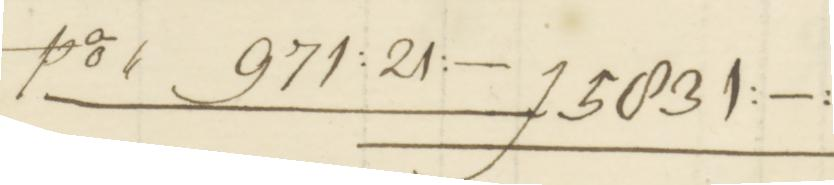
p a/o „ 971: 21:— ƒ 5831:—
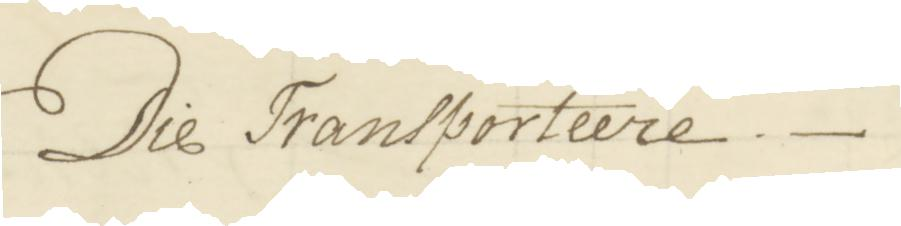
Die Transporteere. —
